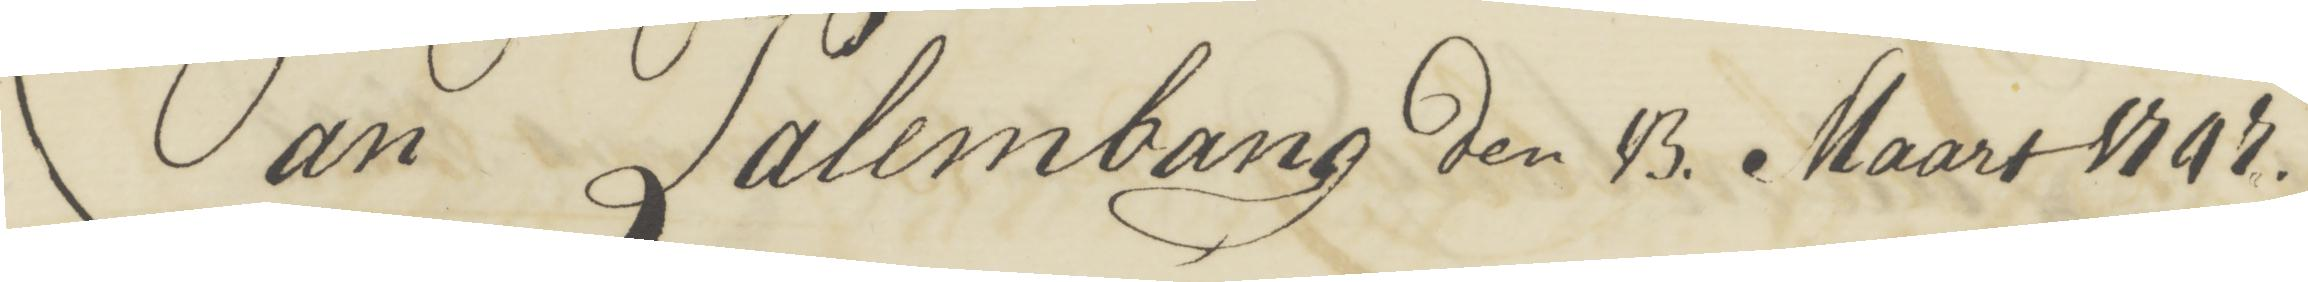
Van Palembang den 13. Maart 1747.
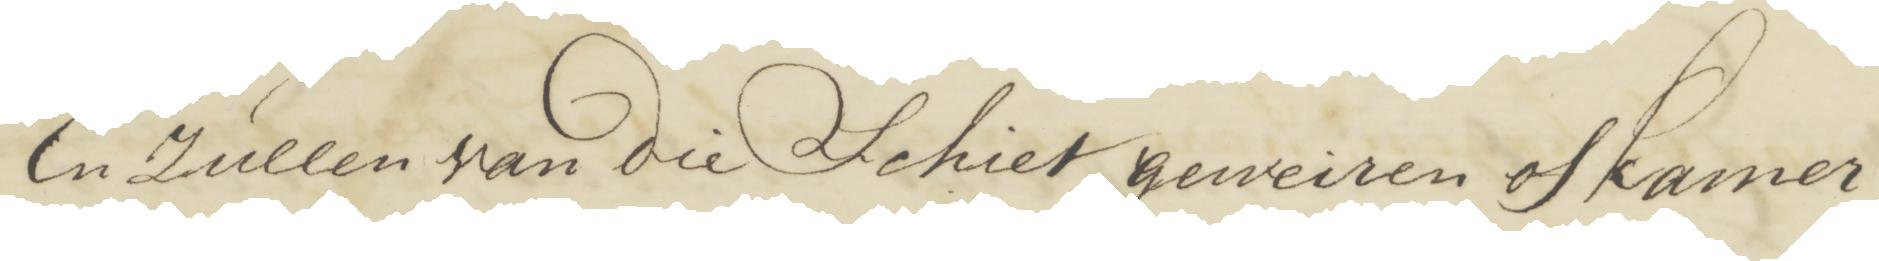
En zullen van die schiet geweiren of kamer
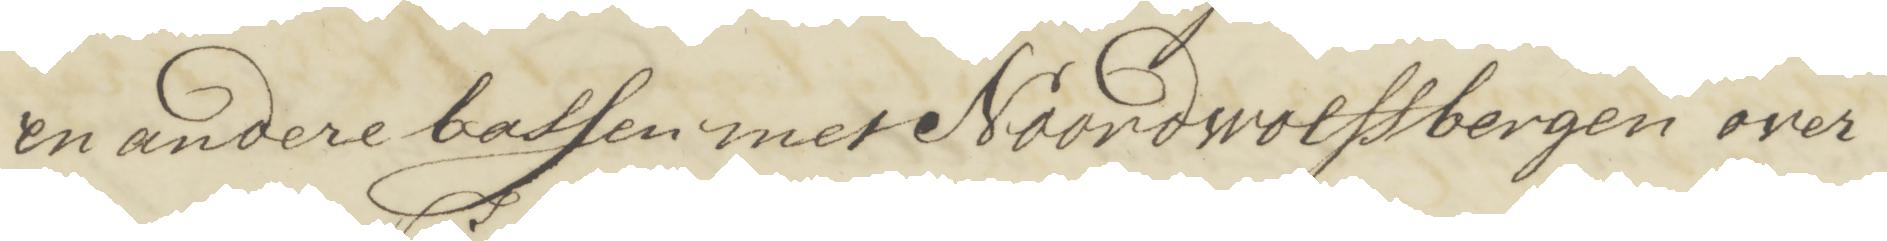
en andere bassen met Noordwolfsbergen over
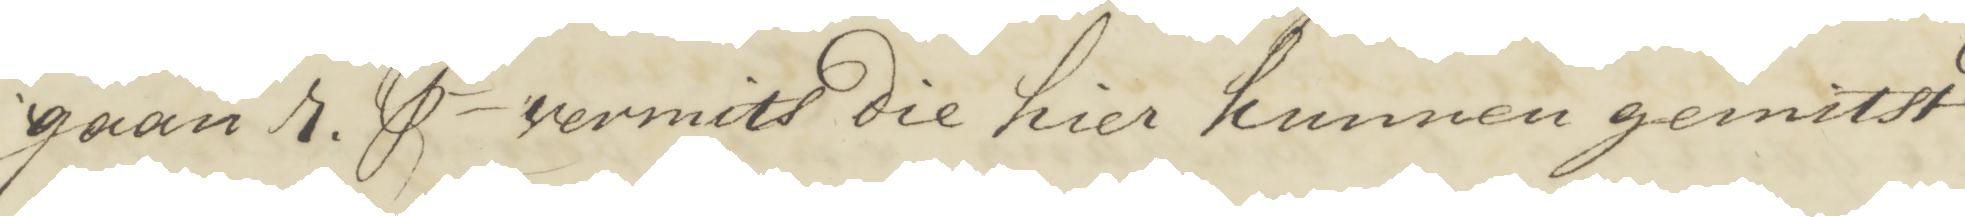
gaan 7. p=s vermits die hier kunnen gemitst
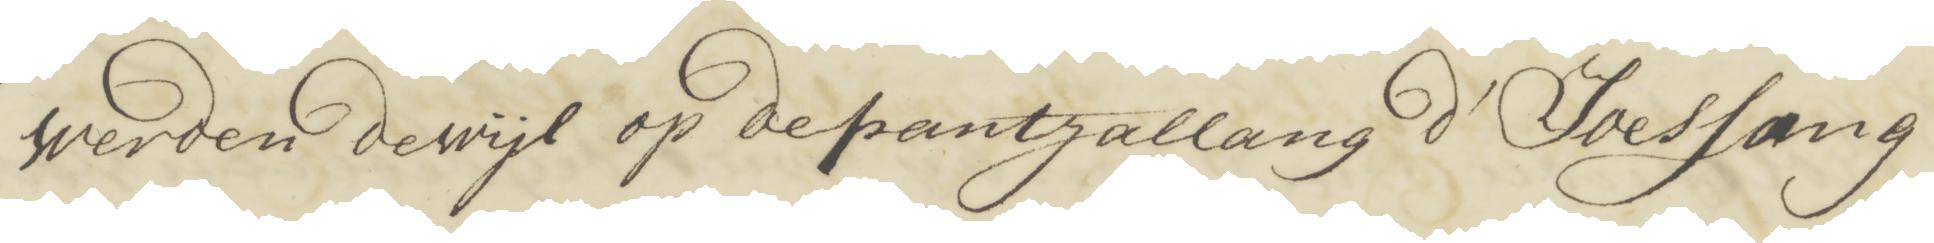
werden dewijl op depantjallang d’ Ioessang
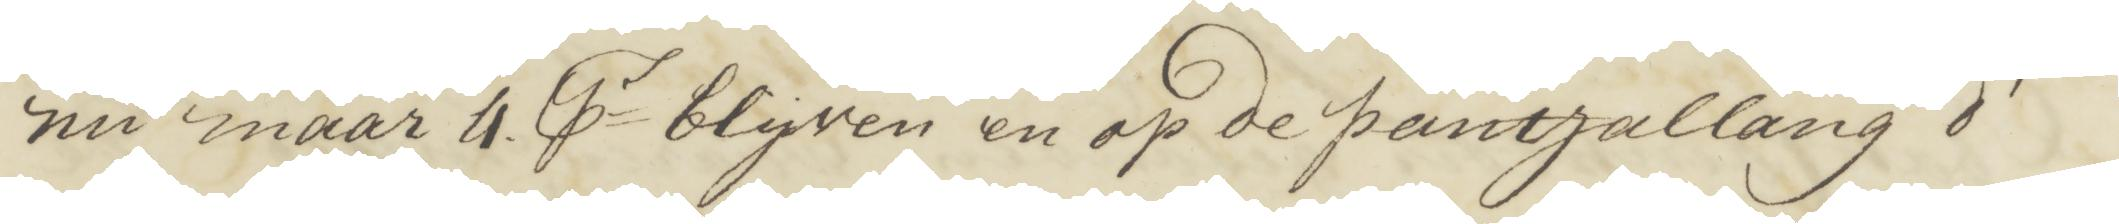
nu maar 4. p=s blijven en op de pantjallang d'
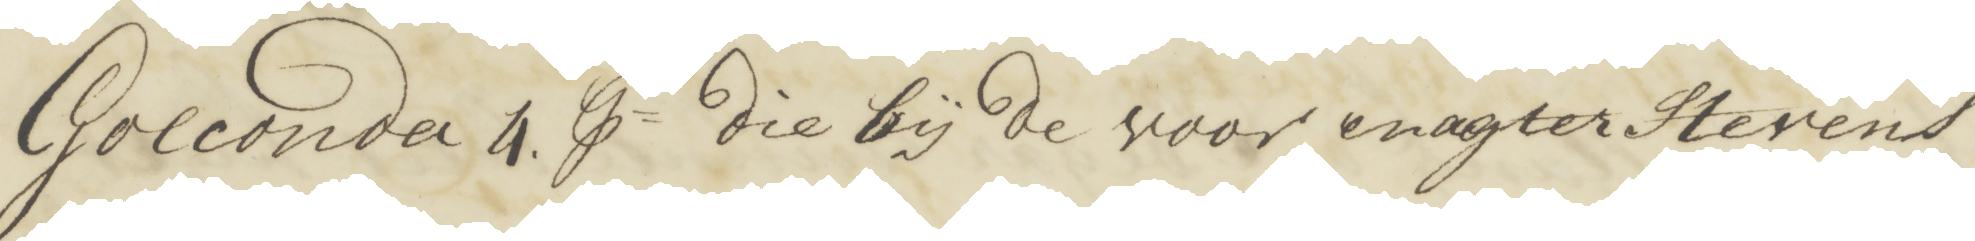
Goeconda 4. p=s die bij de voor en agter stevens
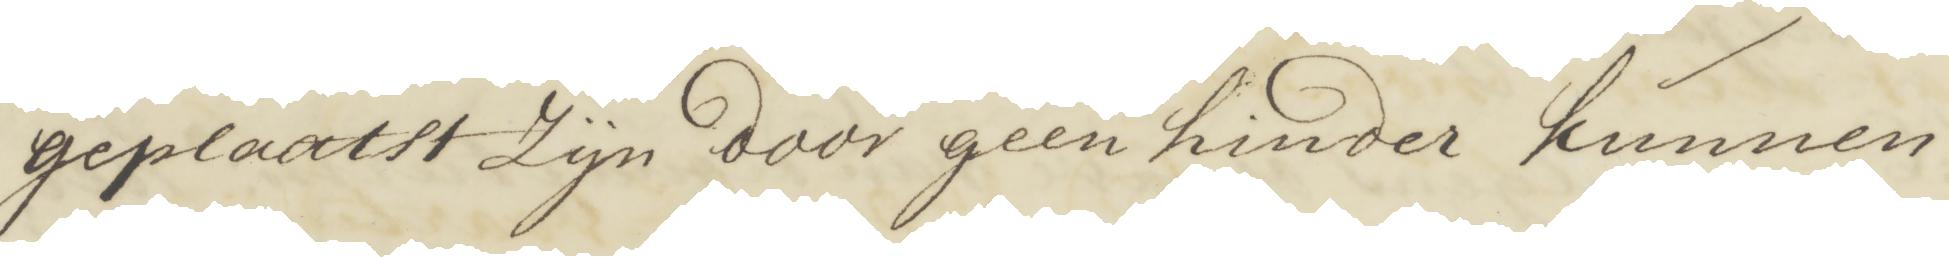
geplaatst zijn door geen hinder kunnen
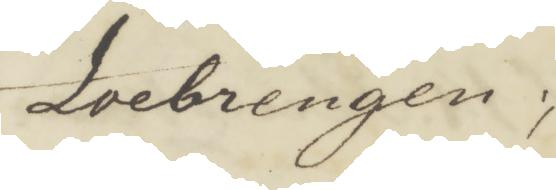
toebrengen;
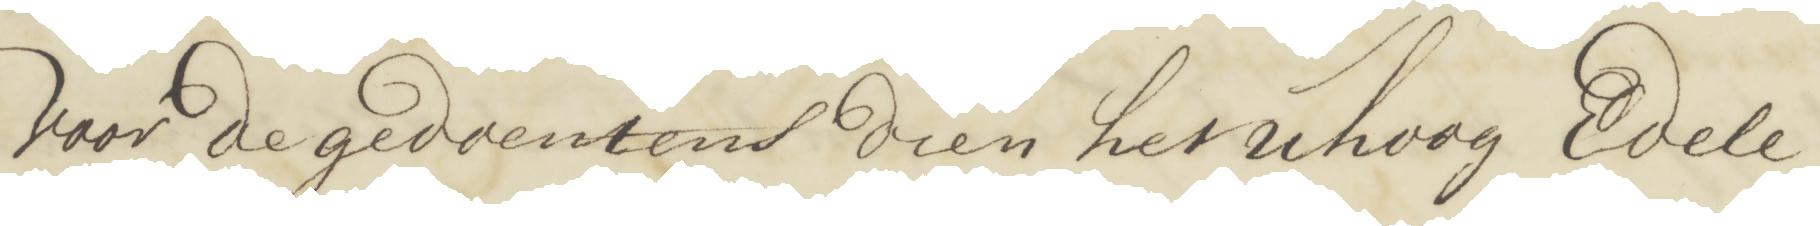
Voor de gedoentens dien het uhoog Edele
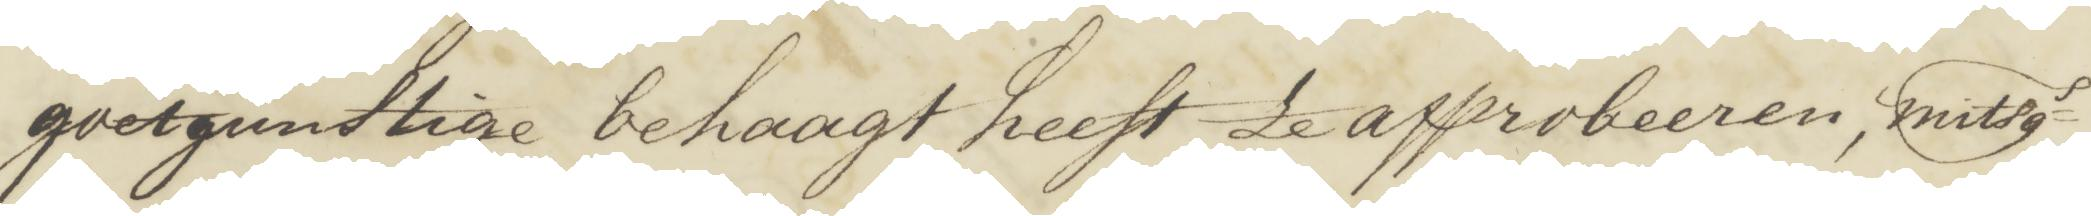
goetgunstige behaagt heeft te approbeeren, mitsg=s
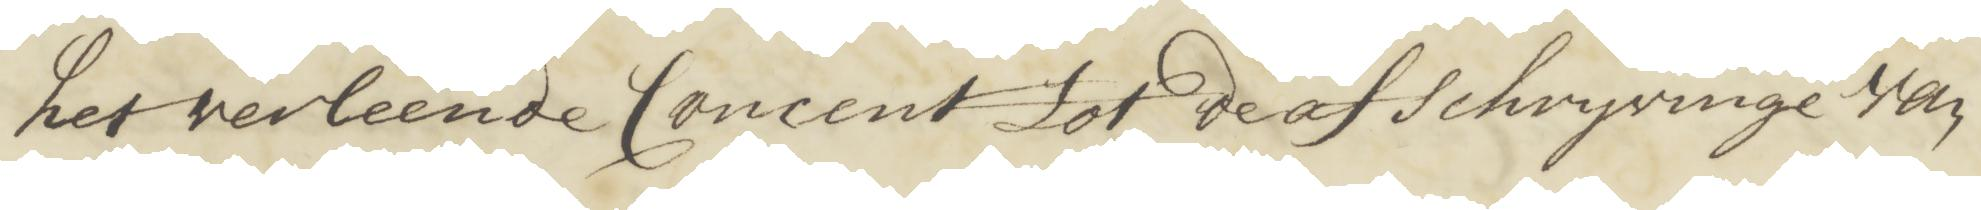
het verleende Concent tot de af schryvinge van
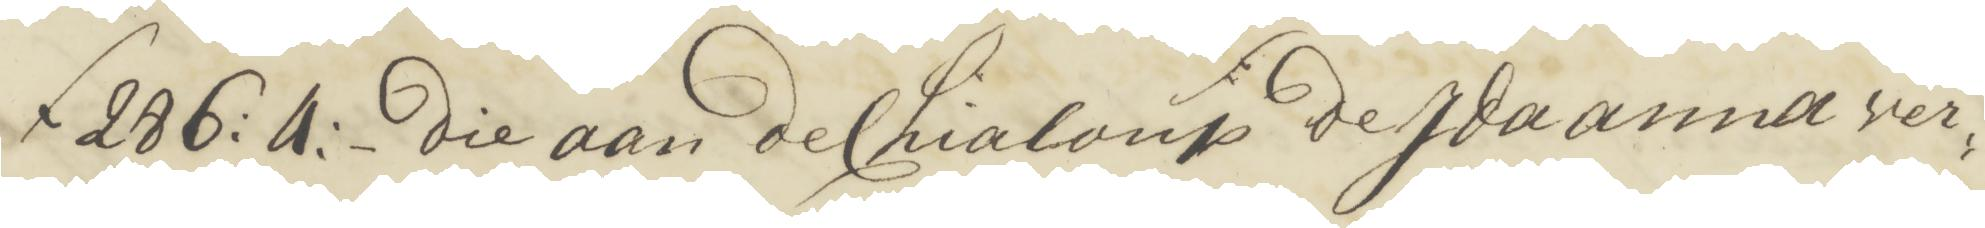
ƒ 286: 4: — die aan de Chialoup de Jdaanna ver„
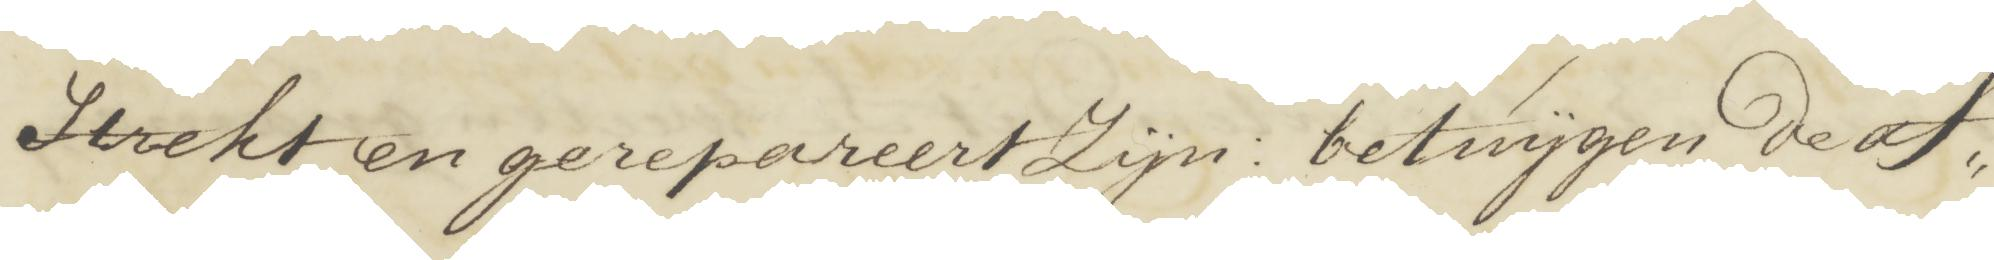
strekt en gerepareert zijn: betuijgen de af„
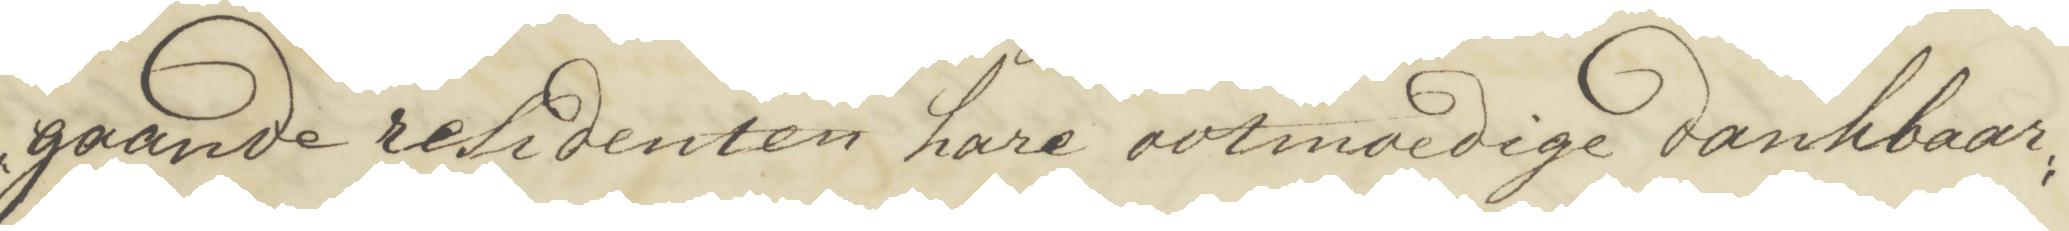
„gaande residenten hare ootmoedige dankbaar„
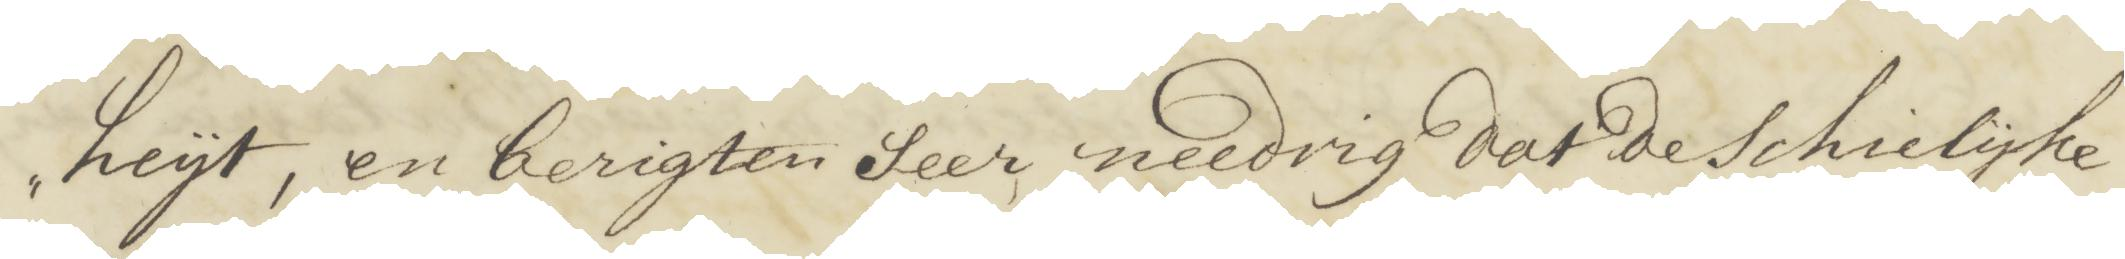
„heijt, en berigten seer needrig dat deschielijke
